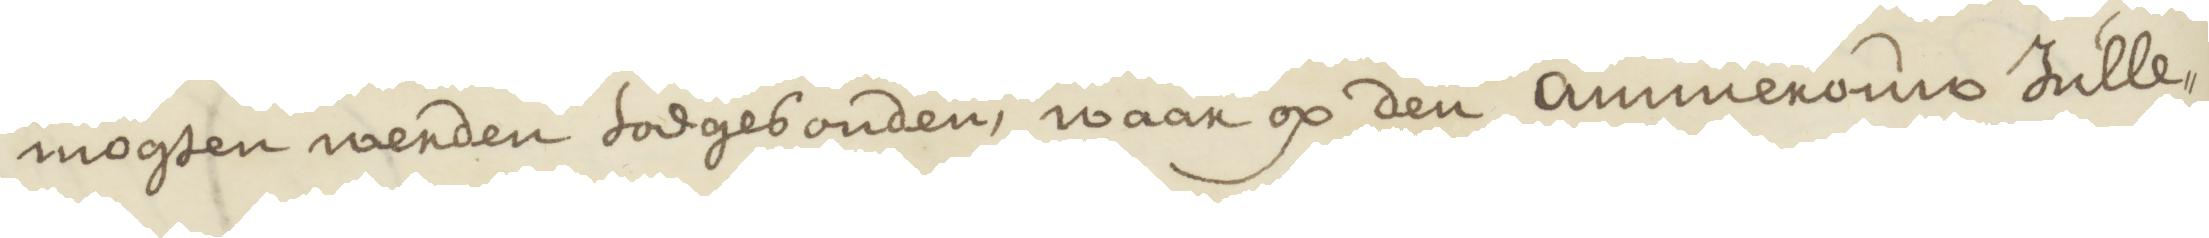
mogten werden toegesonden, waar op den ammerouw Iulle„
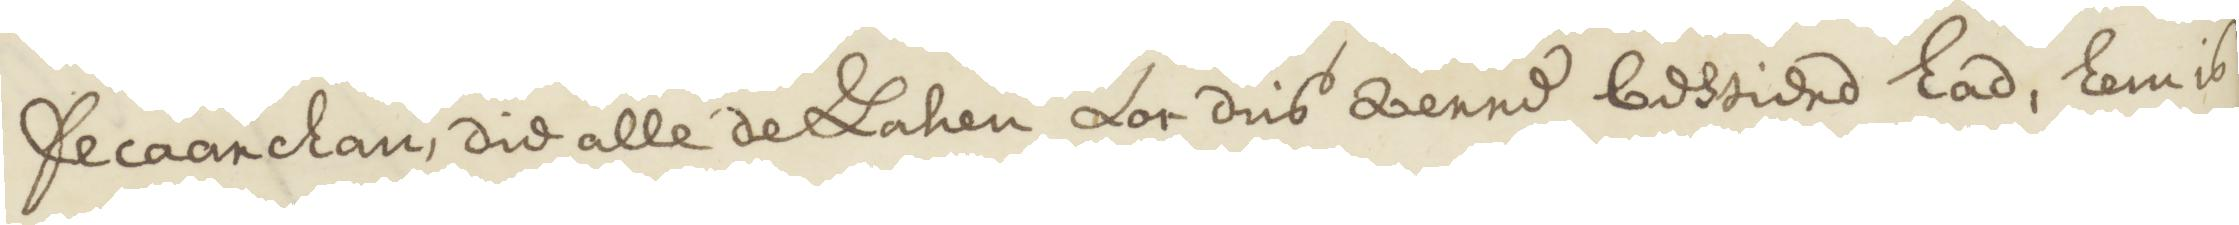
fecaarchan, die alle de Zaken tot dus verre bestierd had, hem is
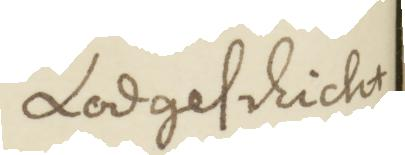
toe geschickt
